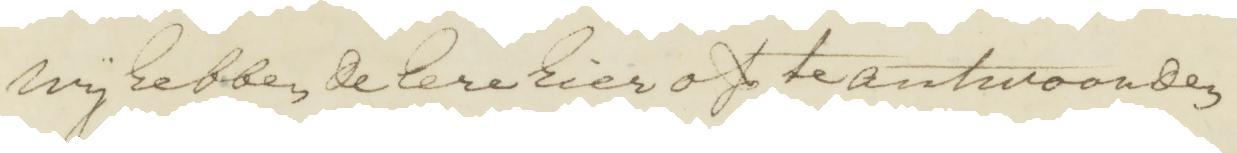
wij hebben de Eere hier op te antwoorden
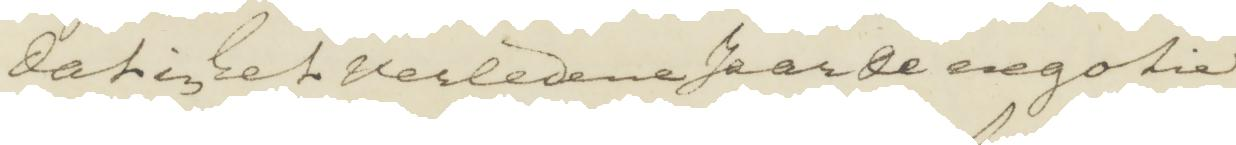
dat in het verledene Jaar de negotie
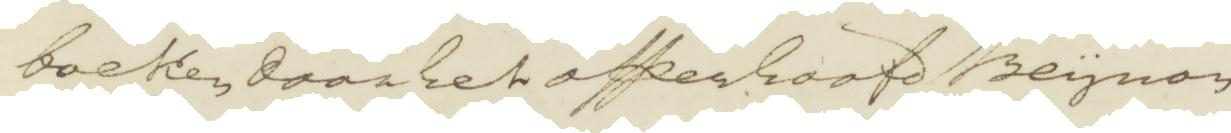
boeken door het opperhoofd Beijnon
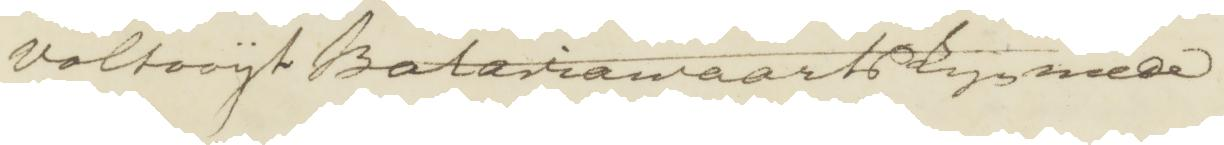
voltooijt Bataviawaarts zijn mede
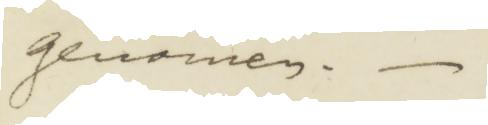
genomen. —
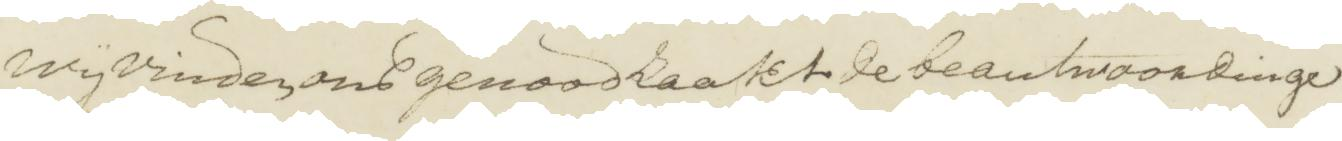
wij vinden ons genoodzaakt de beantwoordinge
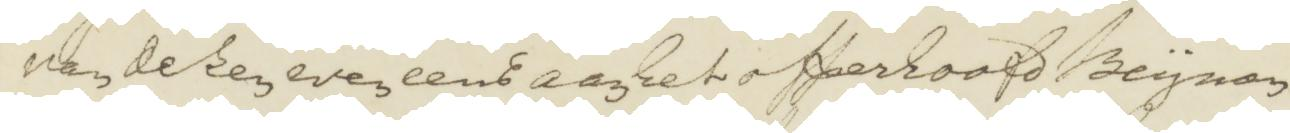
van dezen even eens aan het opperhoofd Beijnon
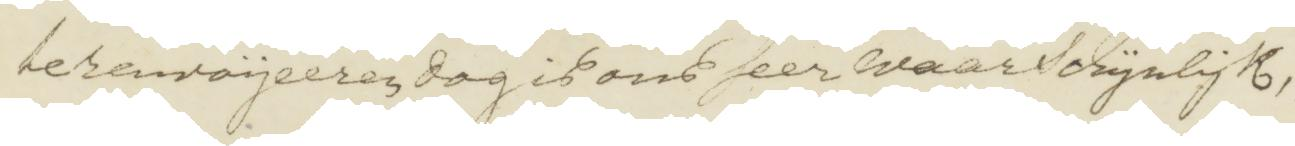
te renvoijeeren dog is ons seer waarschijnlijk,
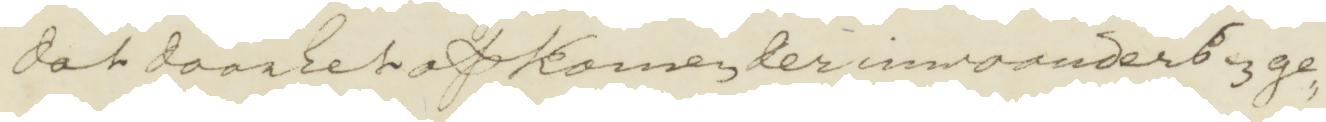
dat door het opkomen der inwoonders en ge„
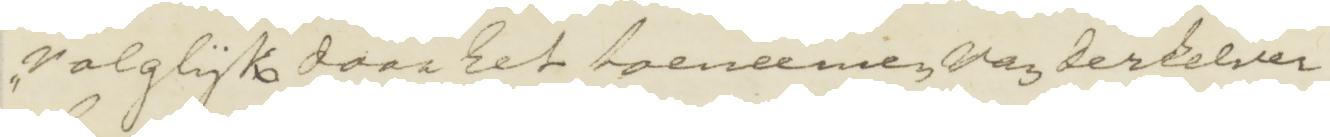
„volglijk door het toeneemen van derzelver
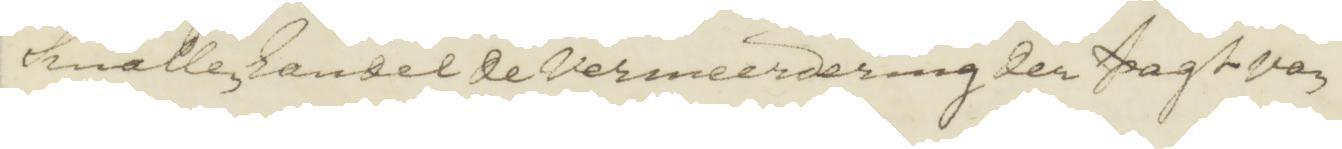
smallen handel de vermeerdering der pagt van
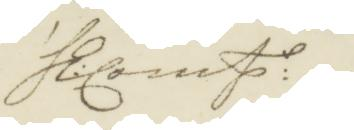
'sE:Comp:s ./.
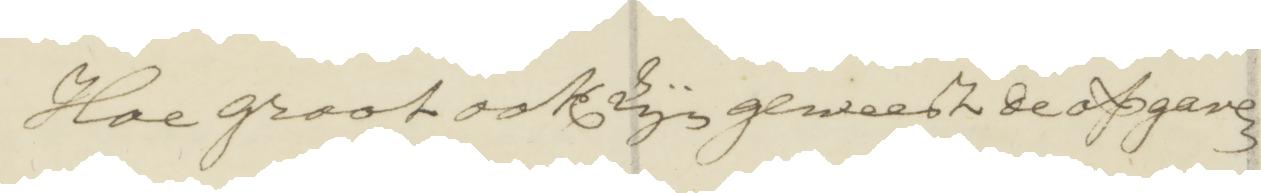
Hoe groot ook zijn geweest de opgaven
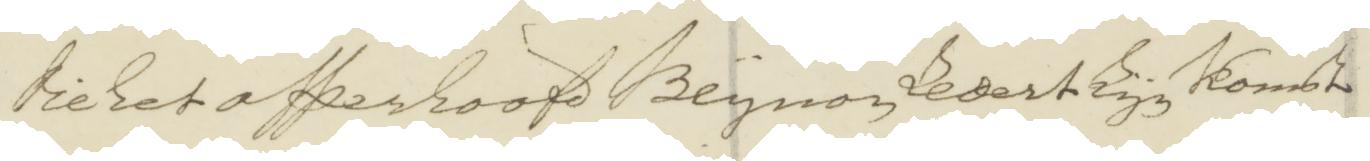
die het opperhoofd Beijnon zedert zijn komst
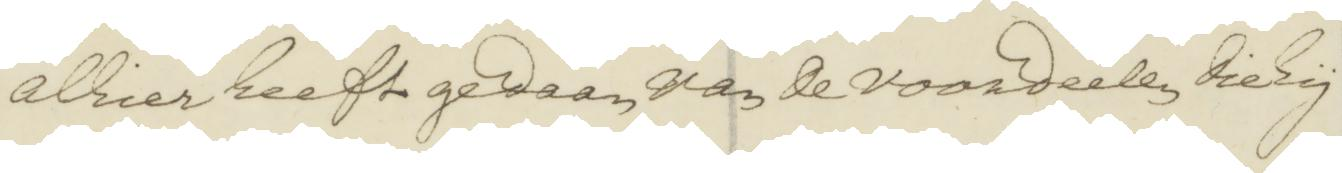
alhier heeft gedaan van de voordeelen die hij
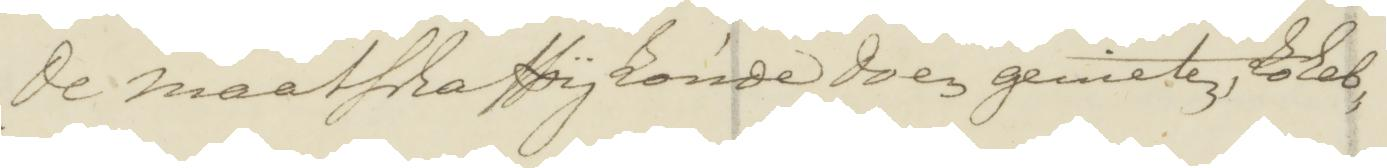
de maatschappij zoude doen genieten, zo heb„
